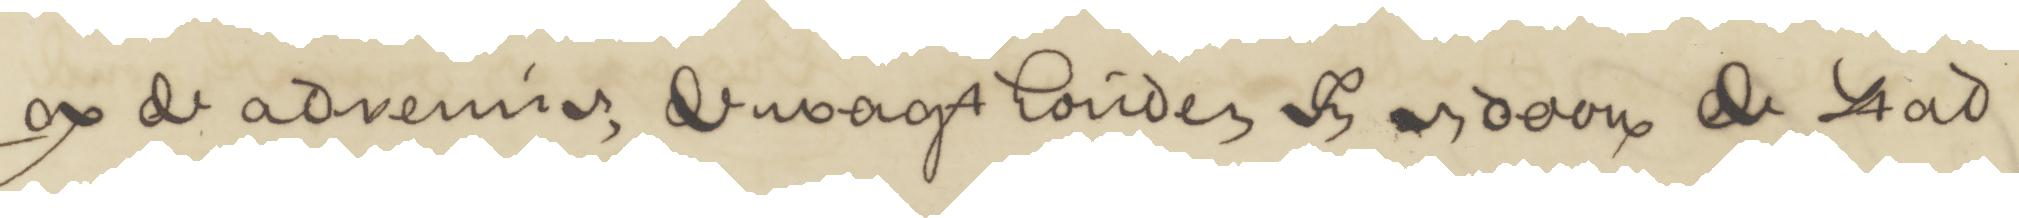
op de advenue, de wagt houden In en door de stad
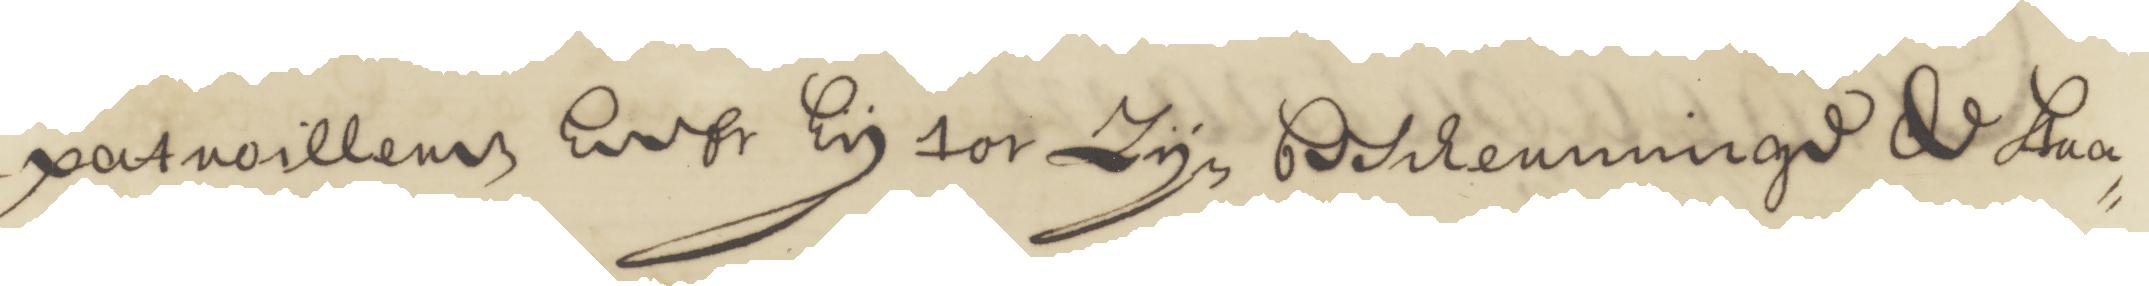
patroilleren heeft hij tot zijn bescherminge de stra„
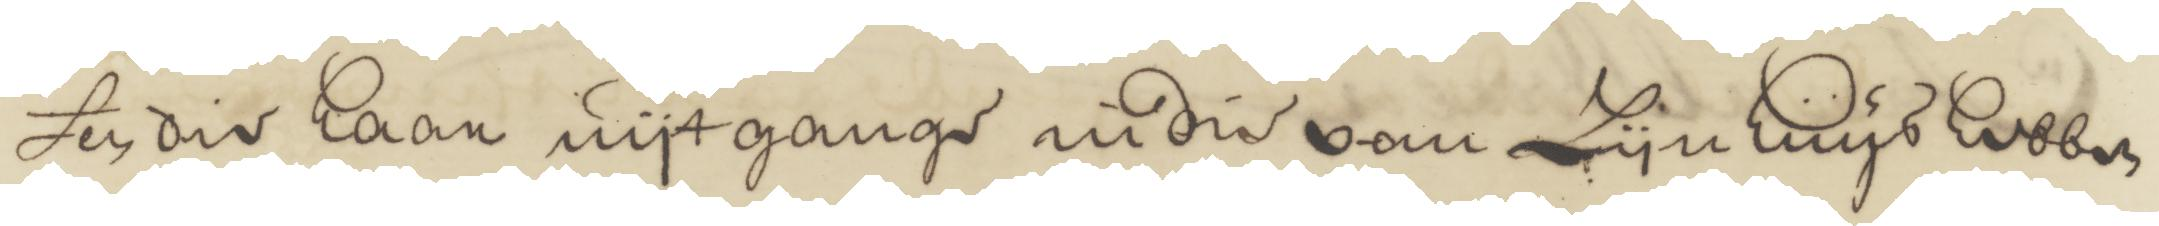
ten die haar uijtgange in die van zijn huijs hebben
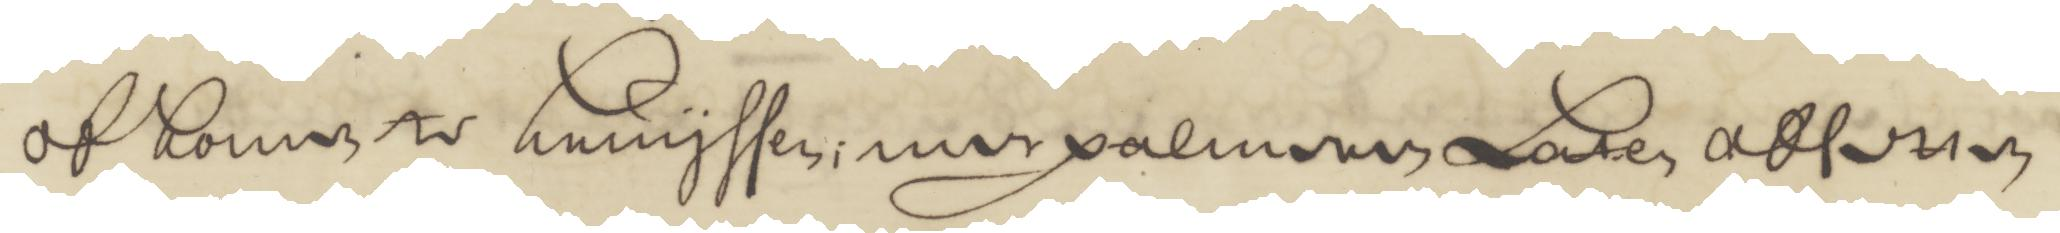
af komen te kruijssen; met palmeren Laten afsetten
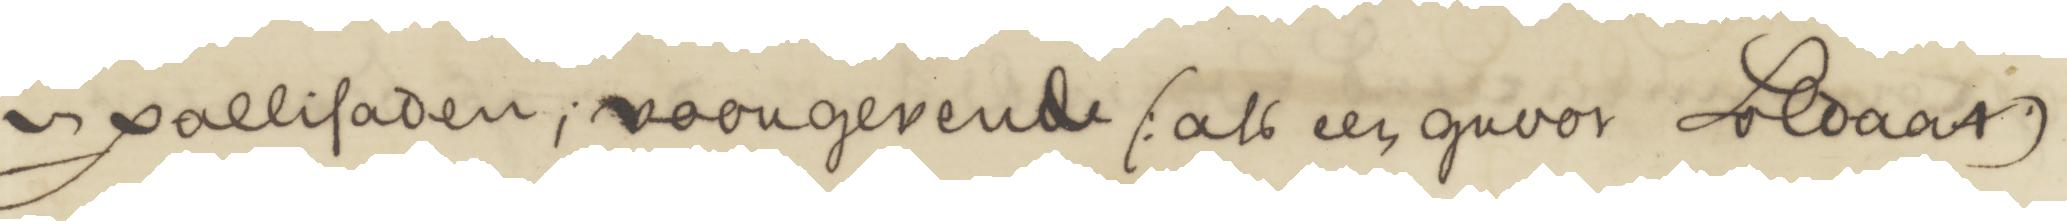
en pallisaden; voorgevende (:als een groot soldaat:)
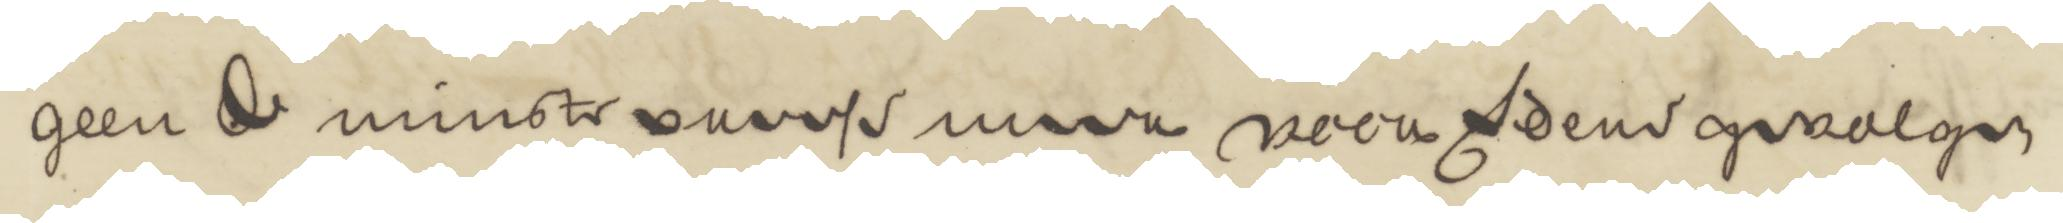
geen de minste vreese meer voor verdere gevolgen
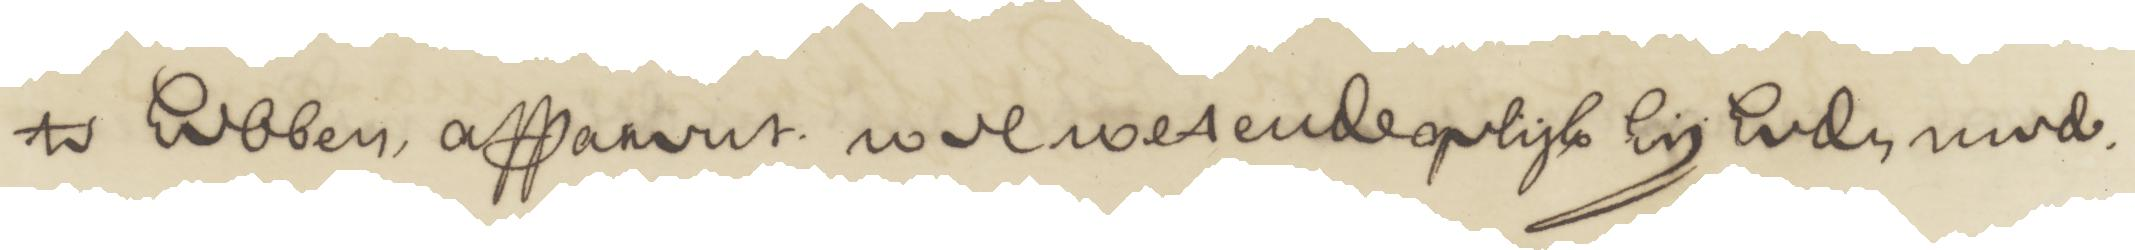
te hebben, apparent wel wetende gelijk hij heden mede.
